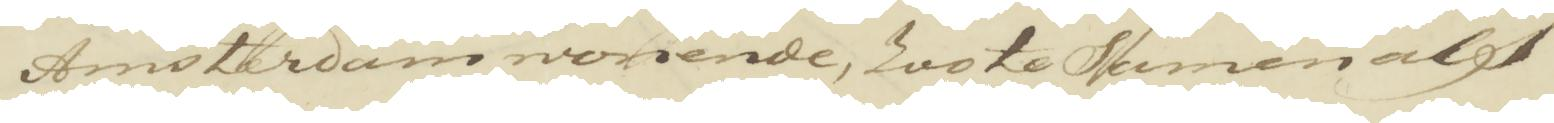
Amsterdam wonende, Zoo te samen als
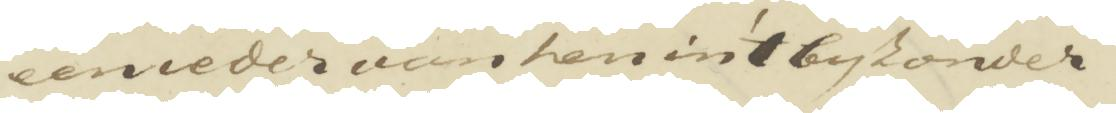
eenieder aan hen in 't byzonder
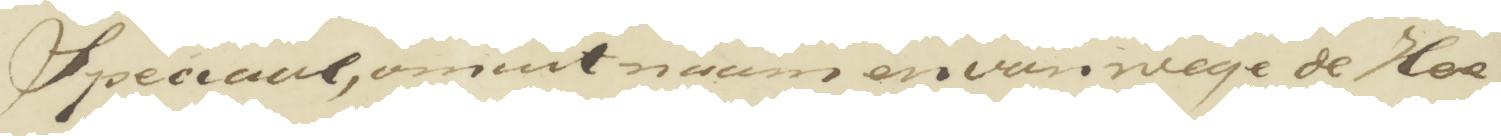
Speciaal, om uit naam en van wege de Hee
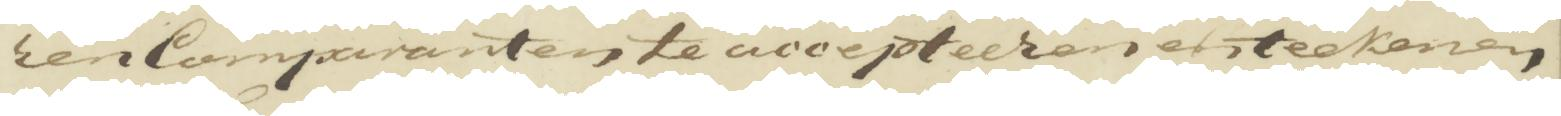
ren Comparanten te accepteeren en teekenen
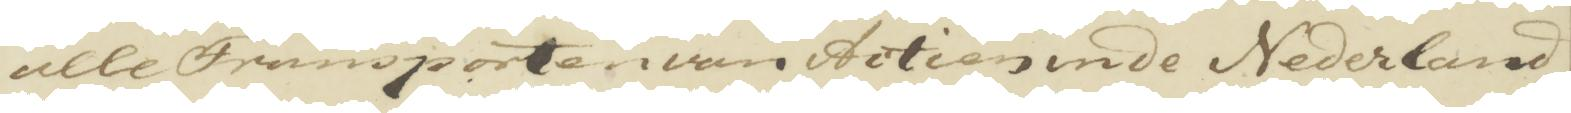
alle Transporten van Actien in de Nederland
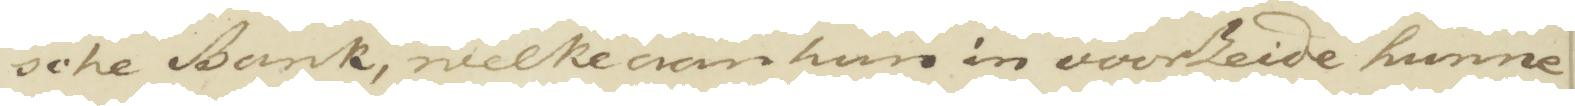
sche Bank, welke aan hun in voorzeide hunne
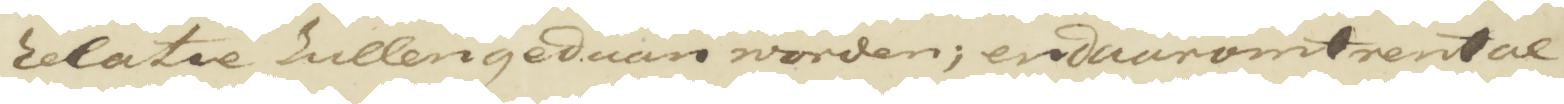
relatie zullen gedaan worden; en daaromtrent al
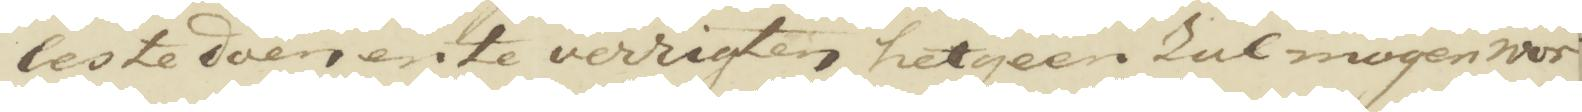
les te doen en te verrigten hetgeen zal mogen wor
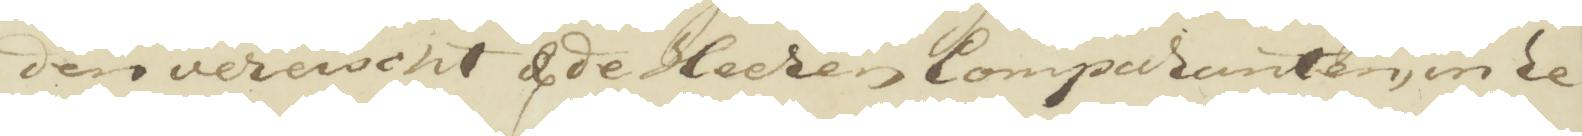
den vereischt & de Heeren Comparanten, in re
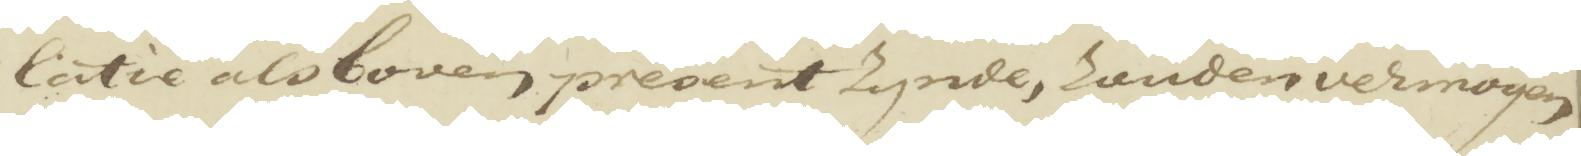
latie als boven present zijnde, zouden vermogen
